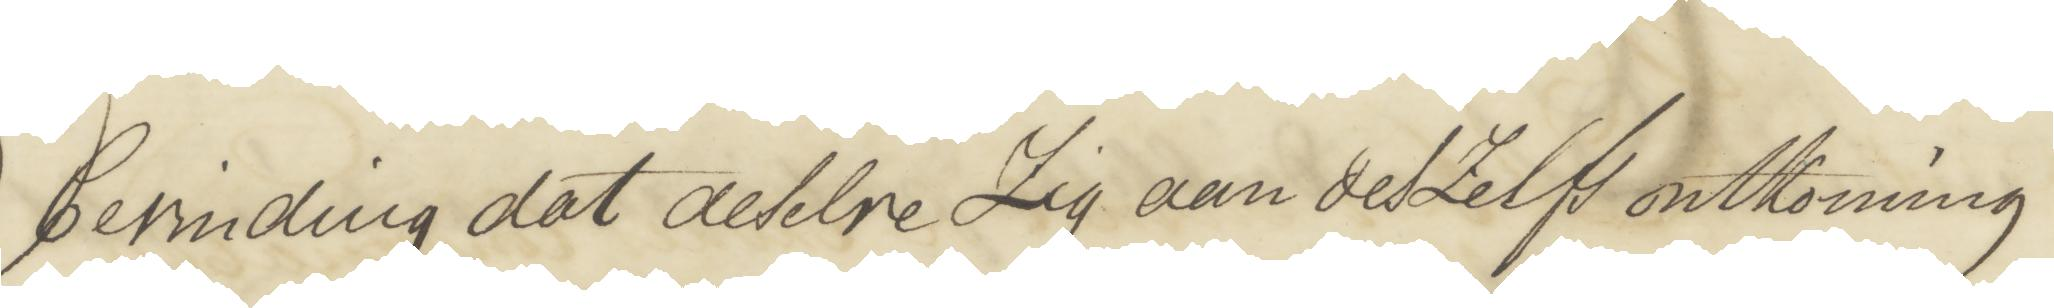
bevinding dat deselve zig aan deszelfs ontkoming
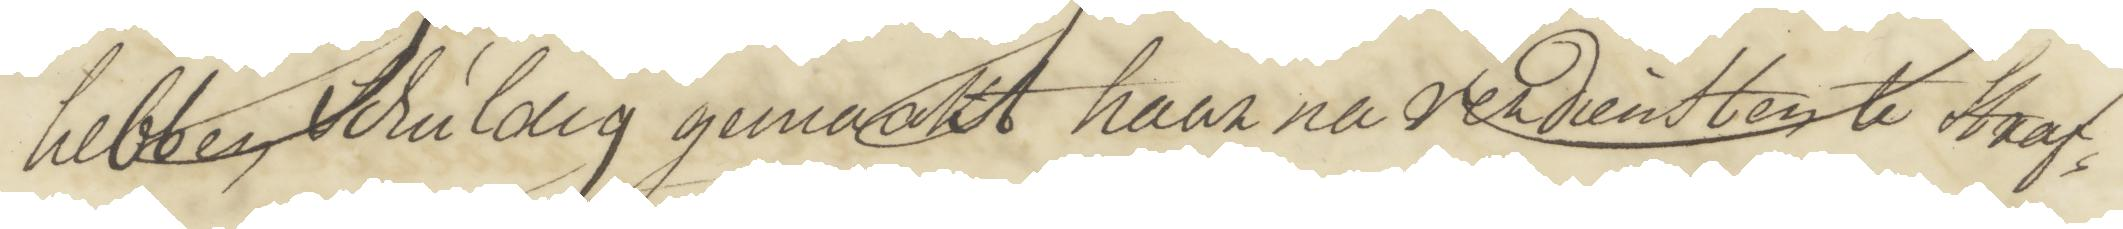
hebben schuldig gemaakt haar na verdiensten te straf„
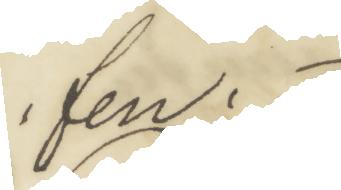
„fen.
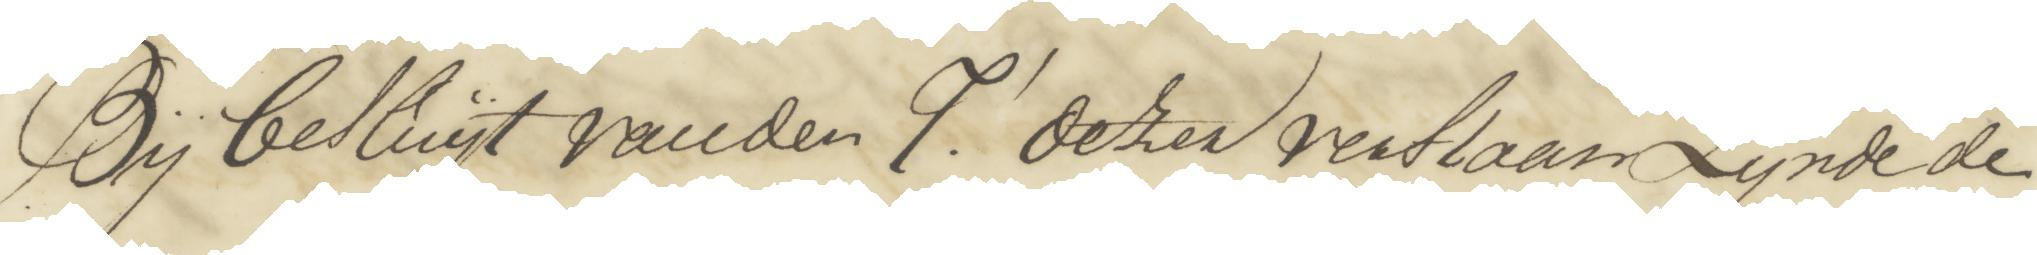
Bij besluijt van den 7.' dezer verstaan zijnde de
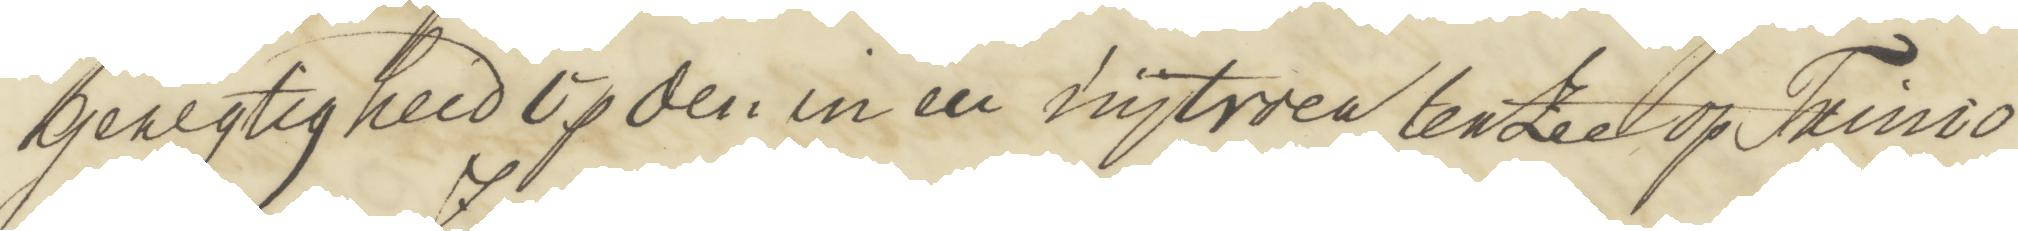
geregtigheid op den in en uijtvoer ter zee op Trinco
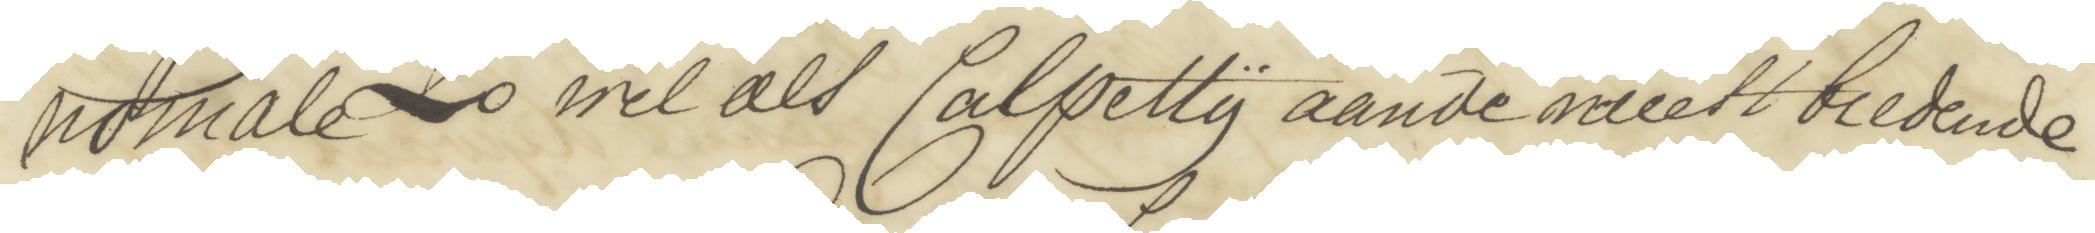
nomale zo wel als Calpettij aan de weest biedende
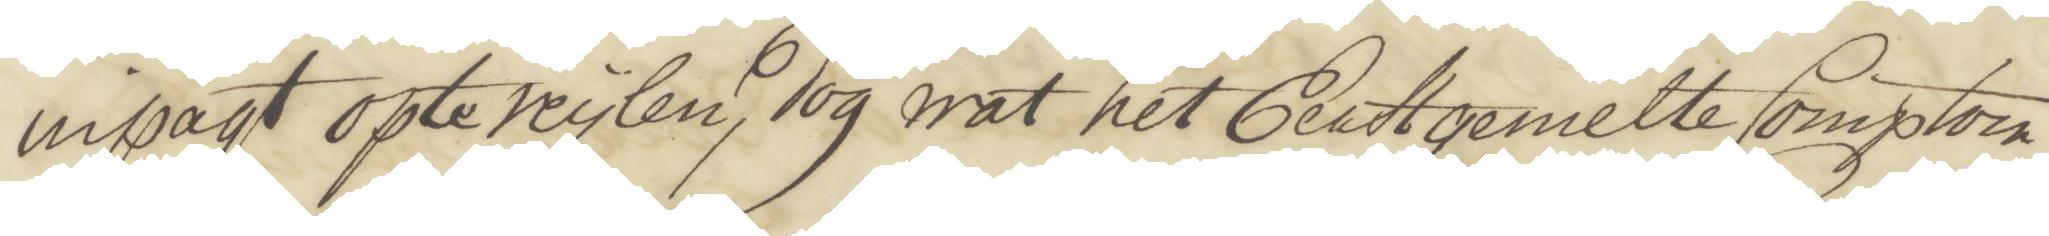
in pagt op te veijlen, dog wat het Eerst gemelte Comptoir
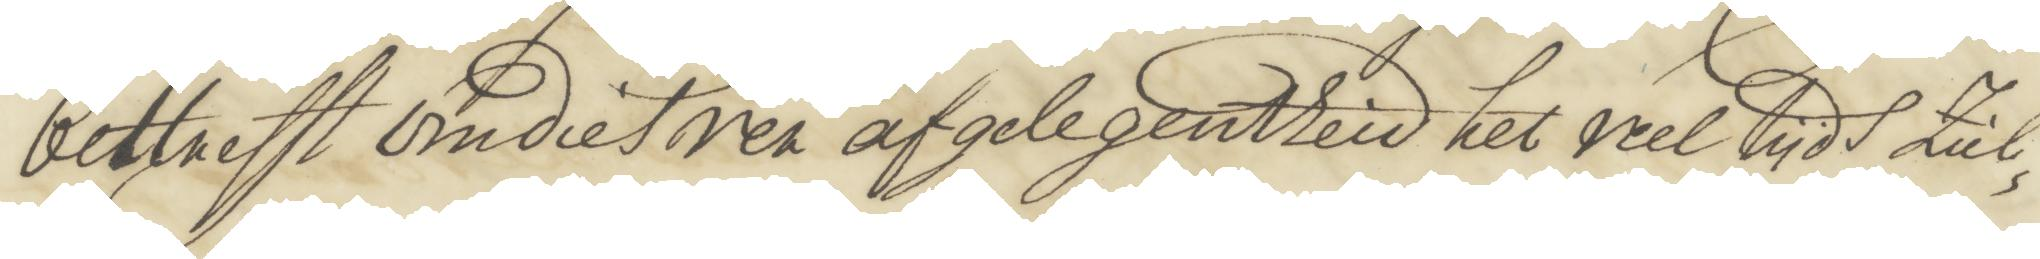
bettrefft om dies ver afgelegentheid het veel tijds zul„
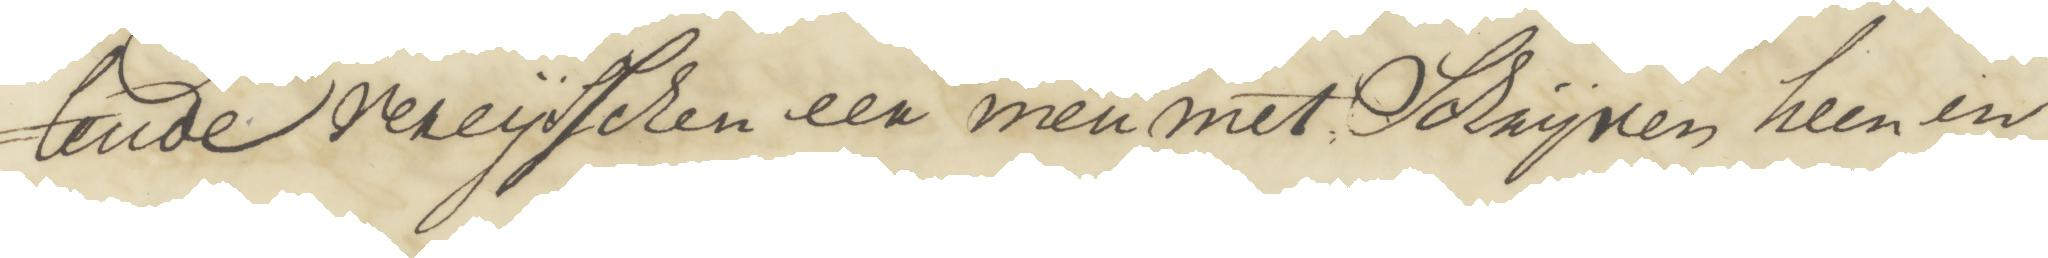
=lende vereijsschen eer men met schrijven heen en
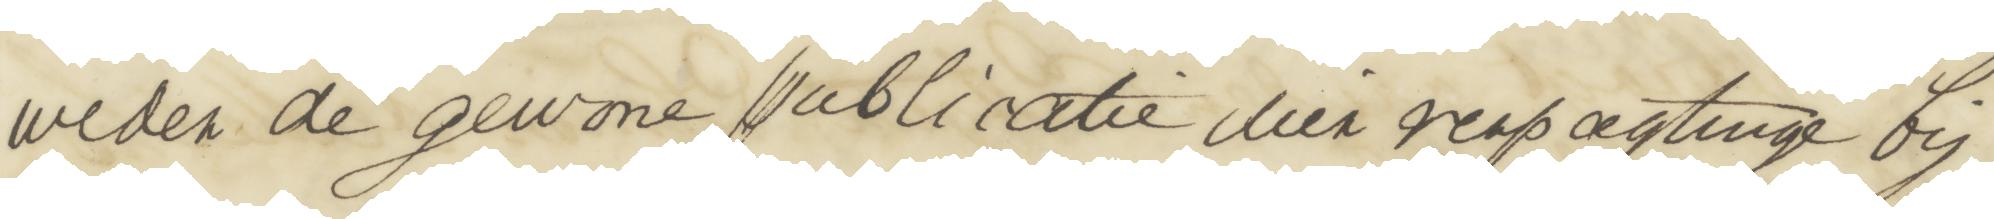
weder de gewone publicatie dier verpagtinge bij
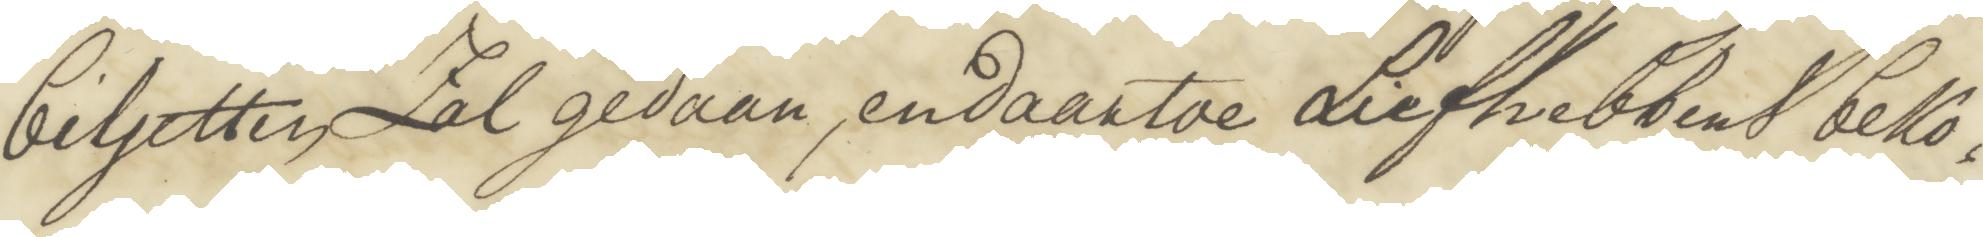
biljetten zal gedaan, en daartoe Liefhebbent beko„
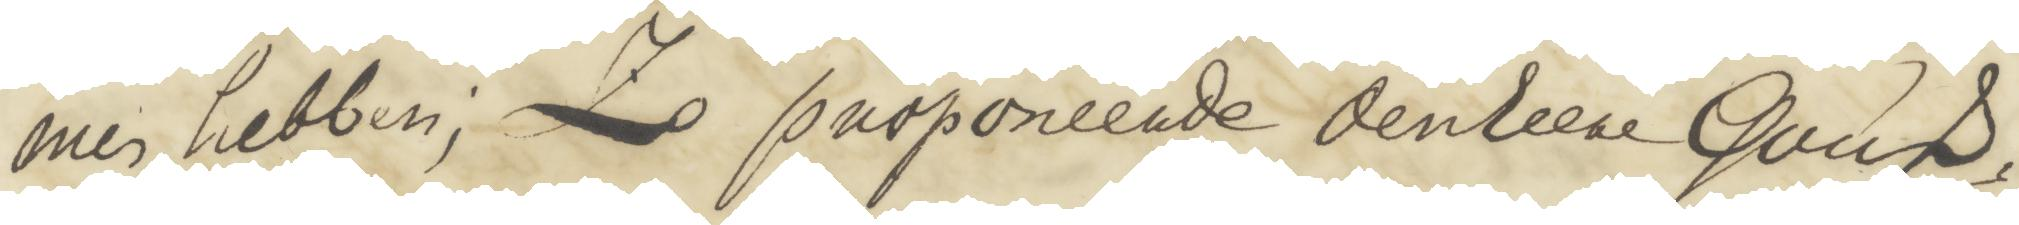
men hebben; zo proponeerde den heere Gouver„
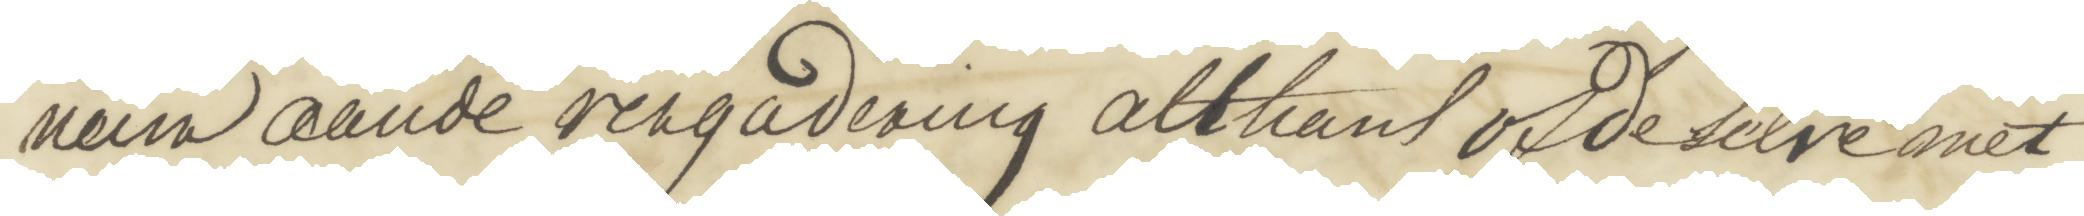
neur aande vergadering althans of de selve met
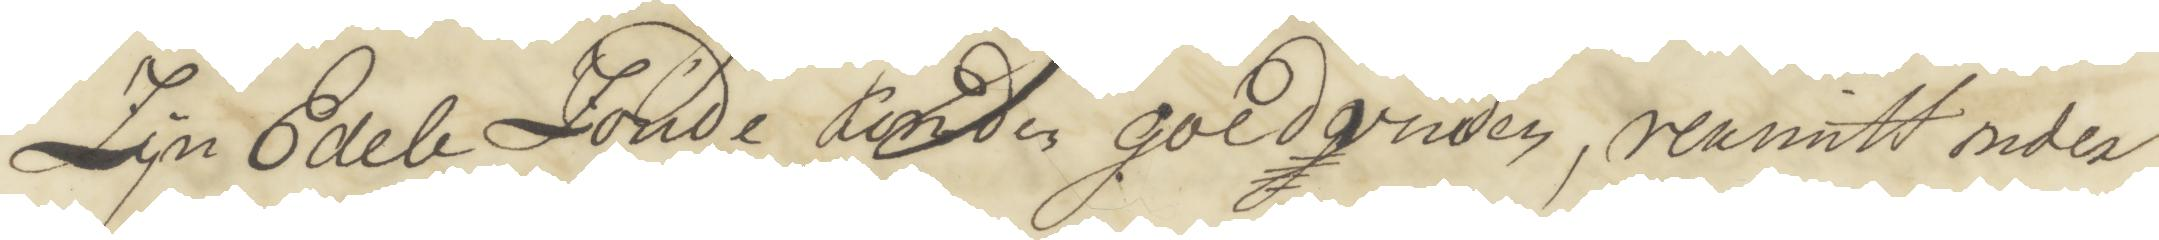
zijn Edele zoude konden goedvinden, vermits onder
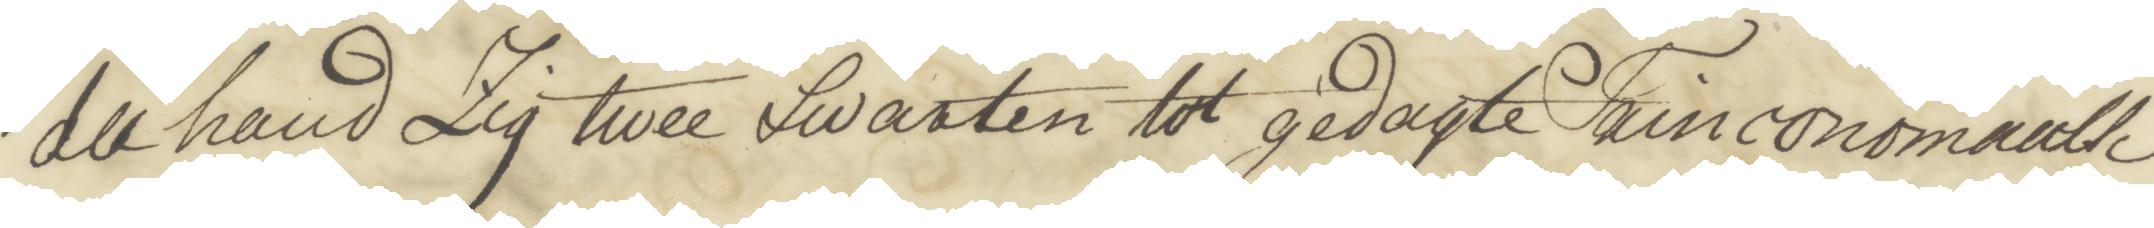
der hand zig twee swarten tot gedagte Trinconomaalse
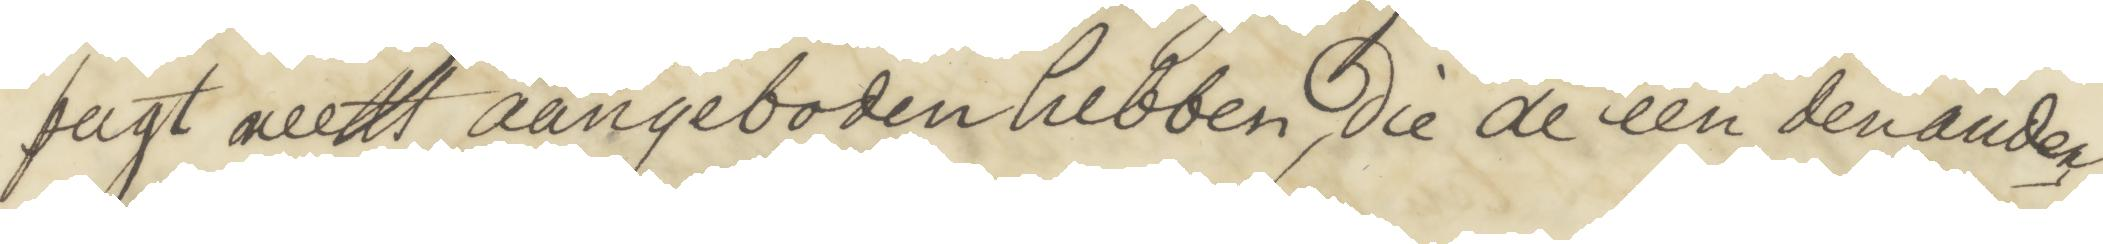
pagt reets aangeboden hebben, die de een den ander
